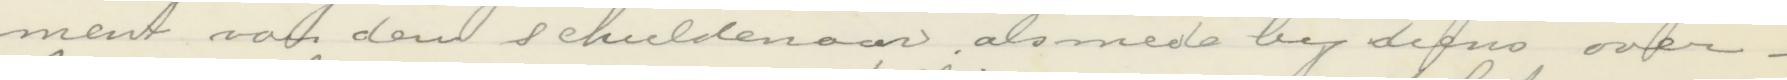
ment aan den schuldenaar, alsmede by diens over
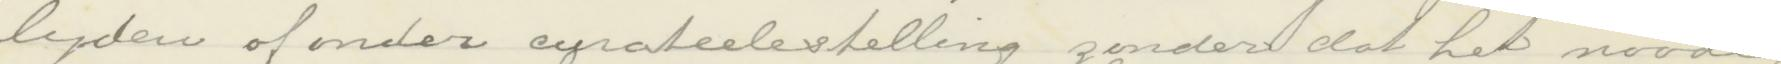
lyden of onder curateelestelling zonder dat het noodig
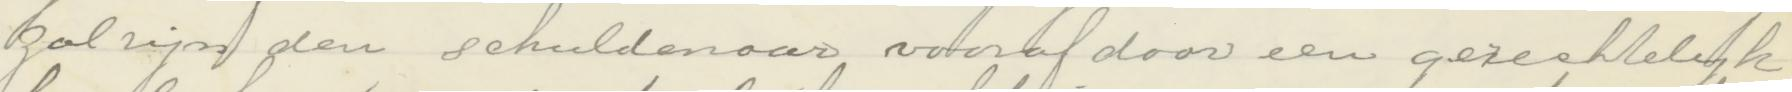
zal zijn den schuldenaar vooraf door een gerechtelyk
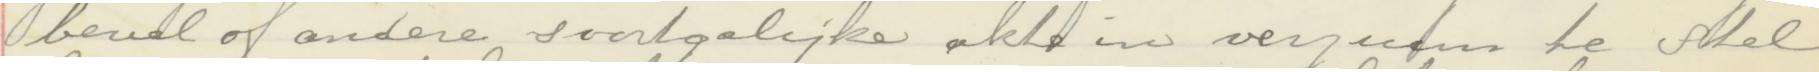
bevel of andere soortgelijke akte in verzuim te stel
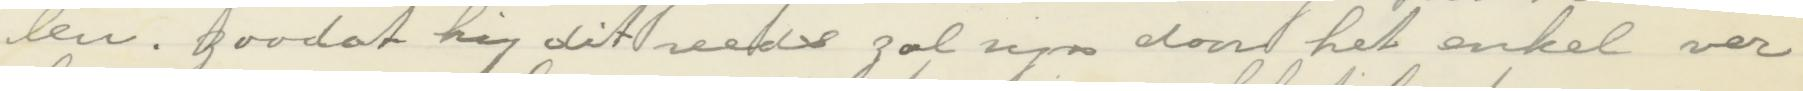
len, zoodat hij dit reeds zal zijn door het enkel ver
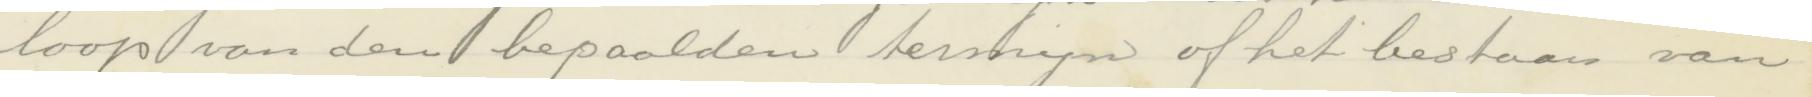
loop van den bepaalden termijn of het bestaan van
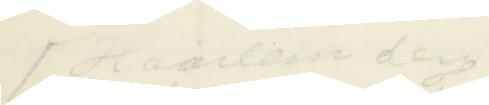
¶ Haarlem den
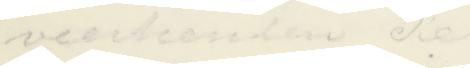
veertienden Fe
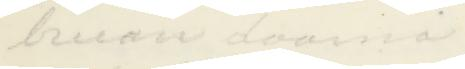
bruari daarna
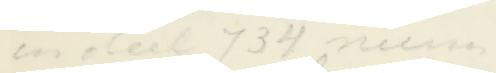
in deel 734, num
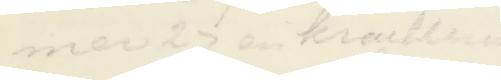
mer 25 en krachtens
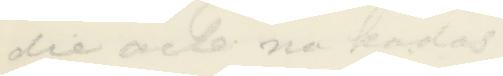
die acte na kadas
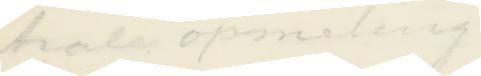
trale opmeting
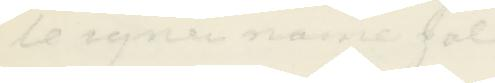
te zynen name zal
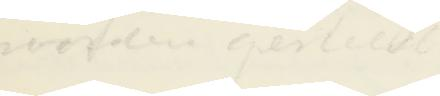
worden gesteld
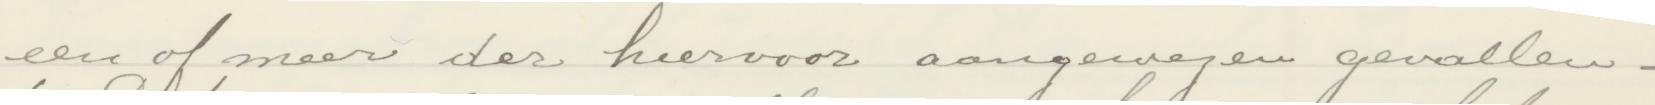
een of meer der hiervoor aangewezen gevallen
